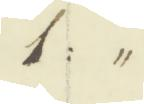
1: „
